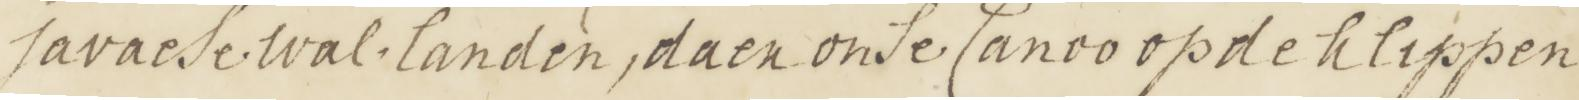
javaese wal-landen, daer onse canoo op de klippen
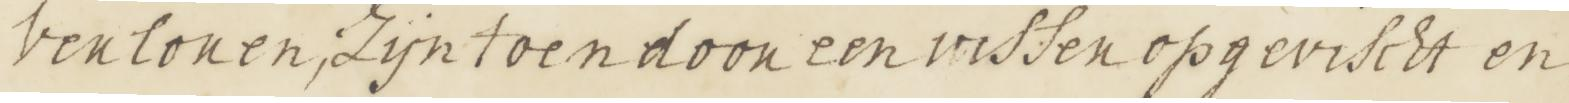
verloren, zijn toen door een visser opgevist en
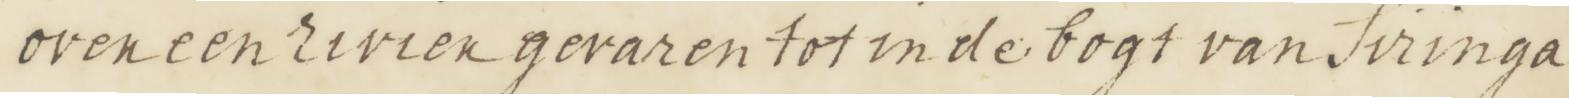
over een rivier gevaren tot in de bogt van siringa
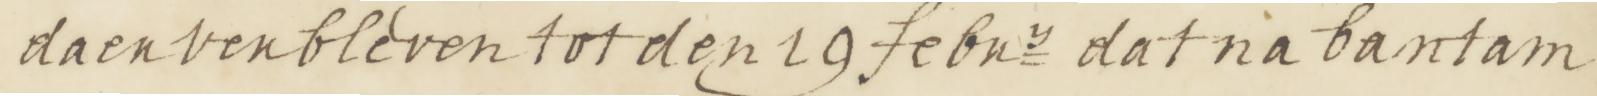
daer verbleven tot den 19 febr=y dat na bantam
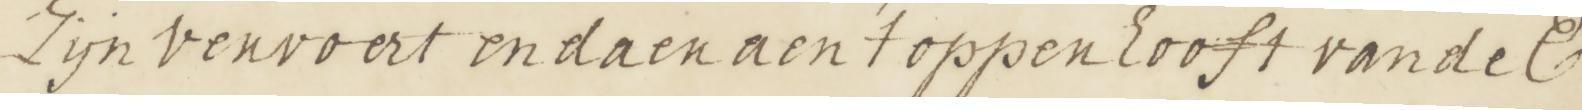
zijn vervoert en daer aen 't opperhooft van de E
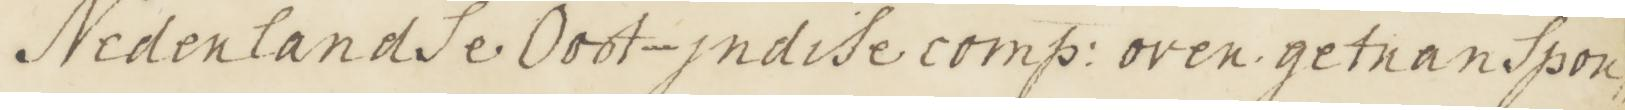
Nederlandse Oost-jndise comp: over getranspor„
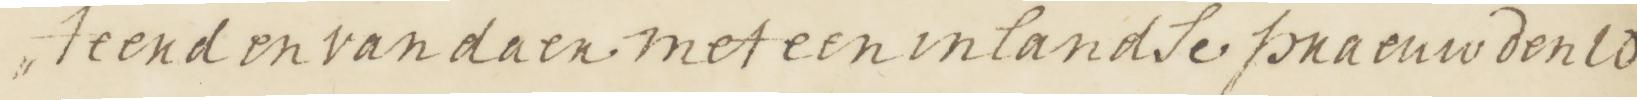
„teerd en van daer met een inlandse praeuw den 10
